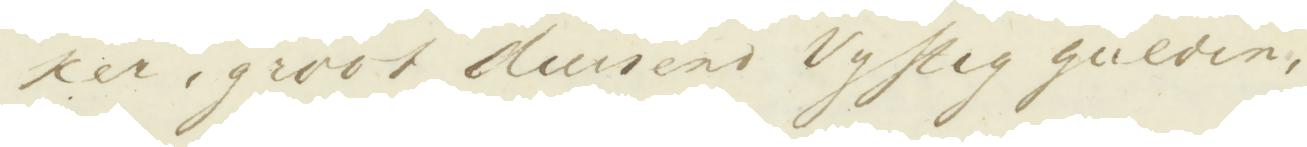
ker, groot duisend Vyftig gulden,
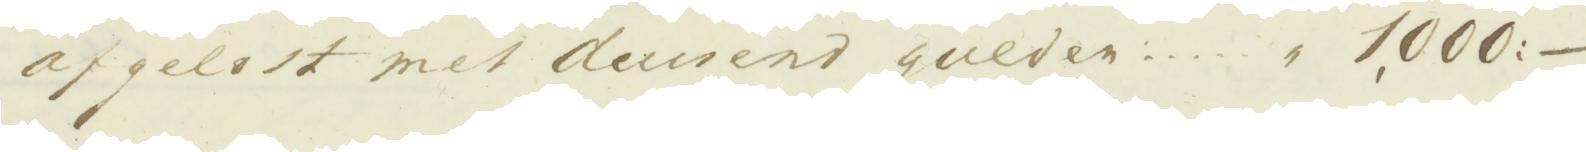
afgelost met duisend gulden. . . . . „1,000:-
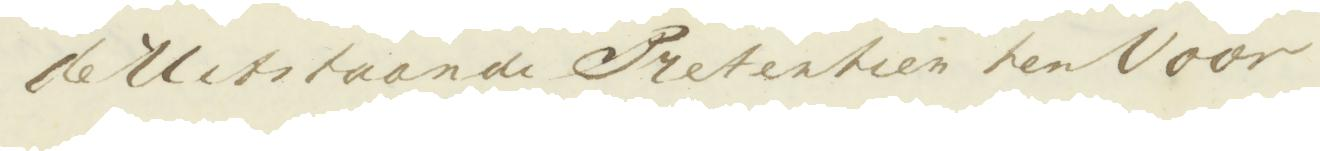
de Uitstaande Pretentien ten Voor
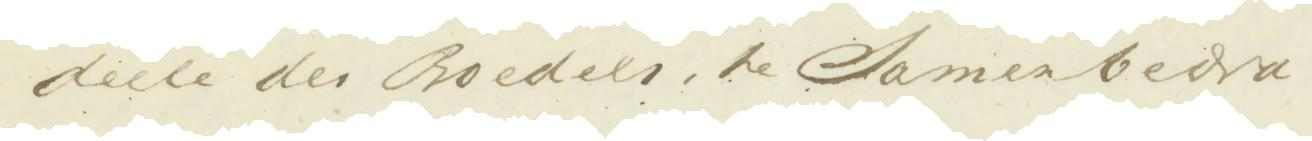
deele des Boedels, te Samen bedra
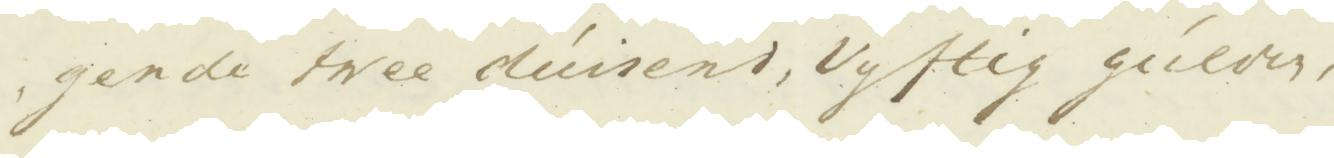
, gende twee duisend, vyftig gulden
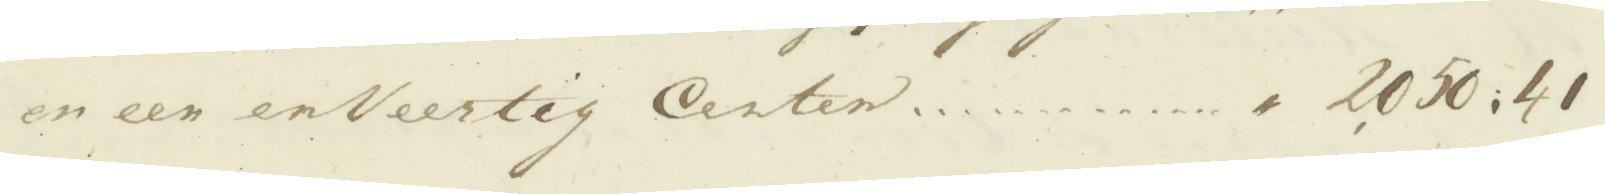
en een en Veertig centen . . . . . . . . . . . . . „ 2,050:41
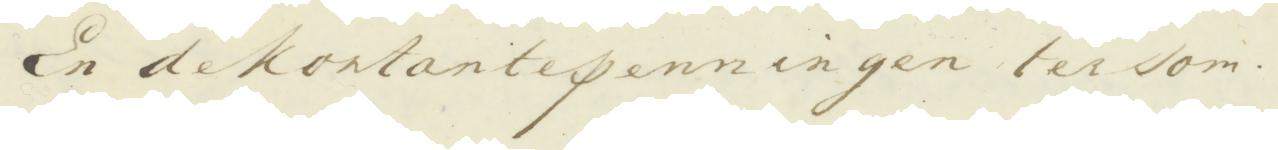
En de kontante penningen ter som.
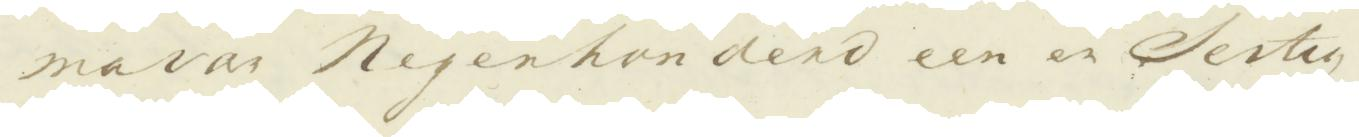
ma van Negenhonderd een en Sestig
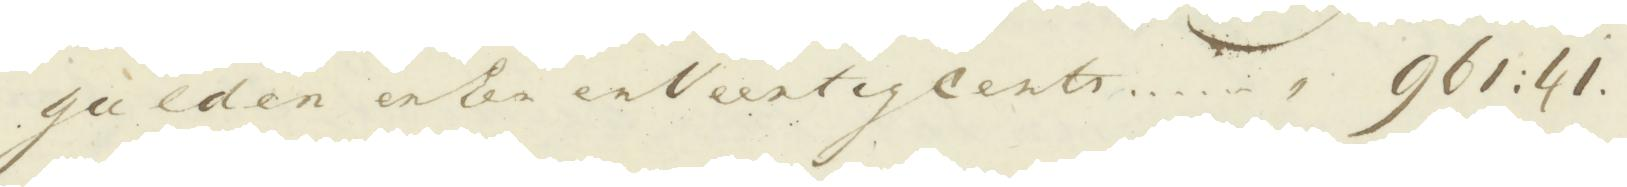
.gulden en Een en Veertig cents . . . . . . „ 961:41.
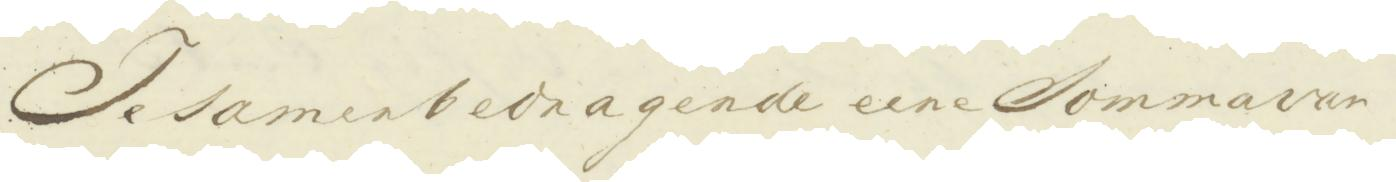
Te samen bedragende eene Somma van
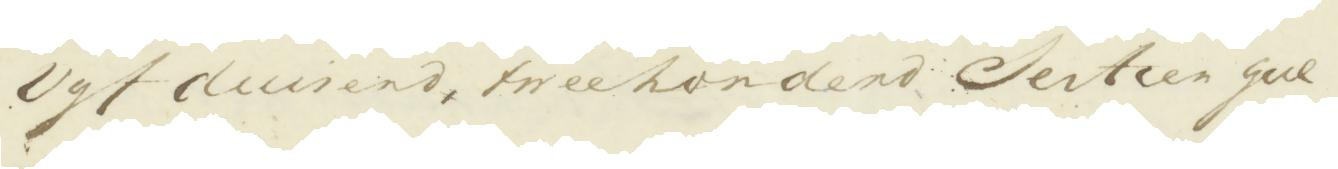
vyf duisend, twee honderd Sestien gul
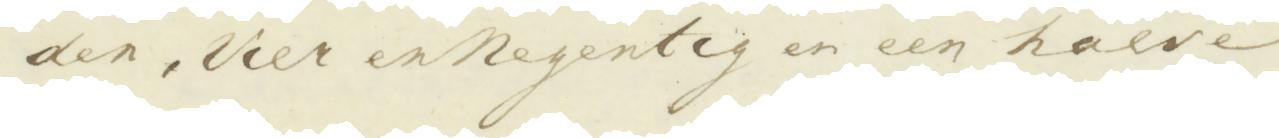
den, vier en negentig en een halve
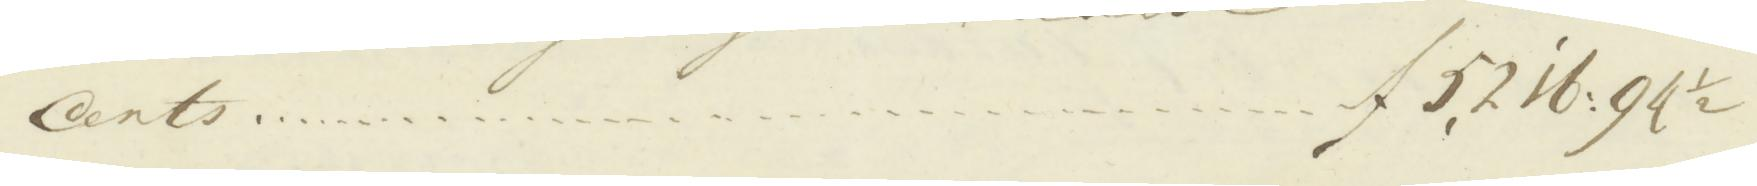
cents . . . . . . . . . . . . . . . . . ƒ5,216:94½
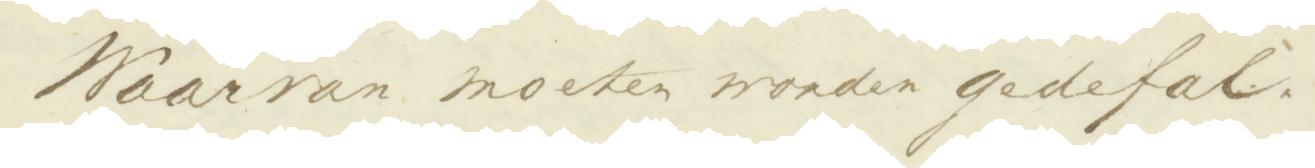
Waarvan moeten worden gedefal.
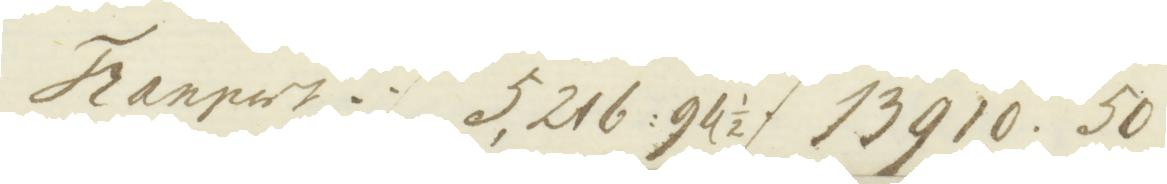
Transport: ƒ 5,216:94½ ƒ13910.50
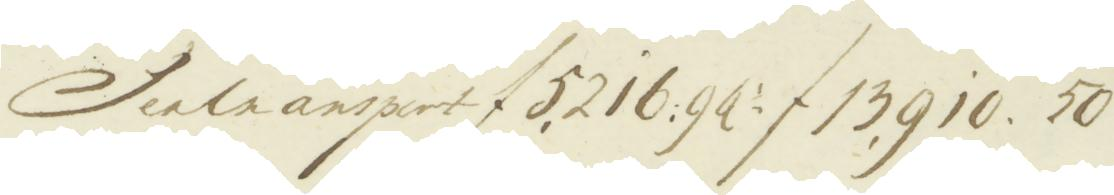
Per transport ƒ5,216:94½ ƒ13,910. 50
